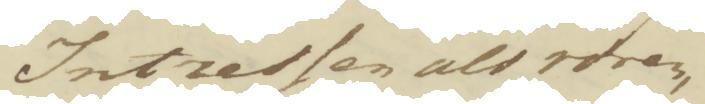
Intressen als voren,
